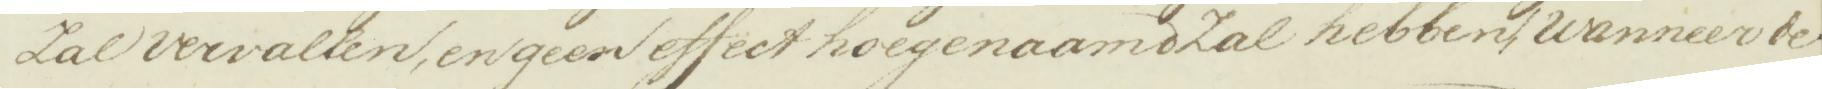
zal vervallen, en geen effect hoegenaamd zal hebben, wanneer de
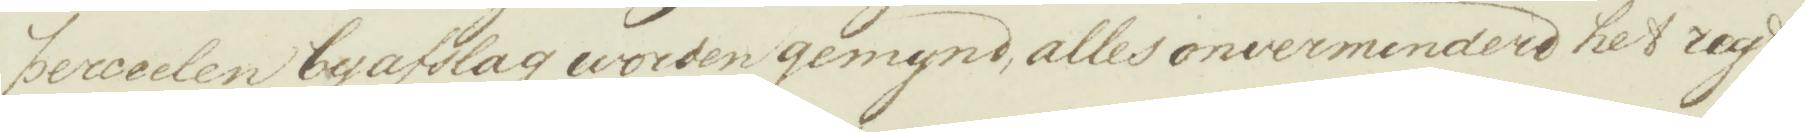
perceelen by afslag worden gemynd, alles onverminderd het regt
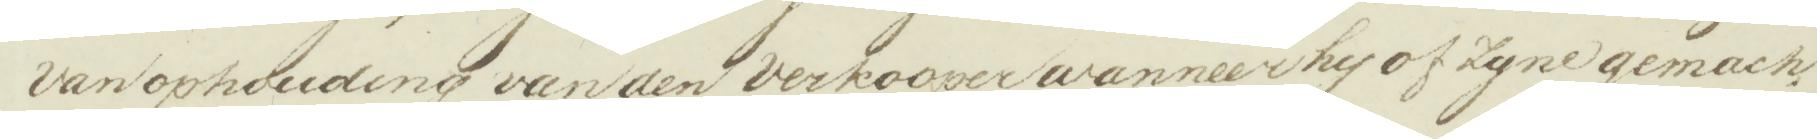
van ophouding van den verkooper wanneer hy of zyne gemach„
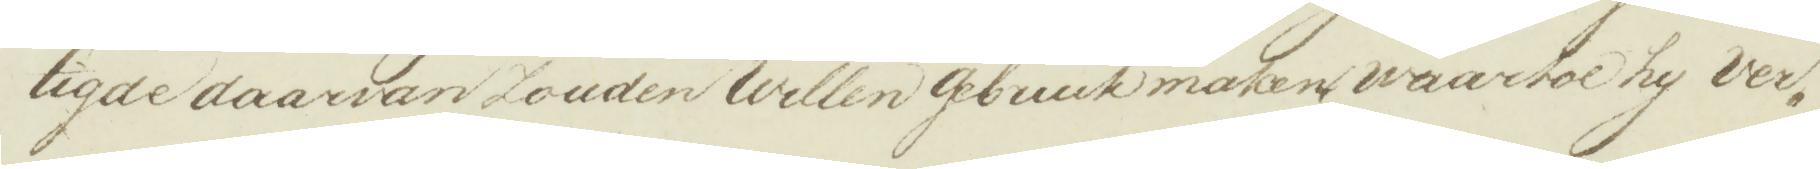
tigde daarvan zouden willen gebruik maken waartoe hy ver„
